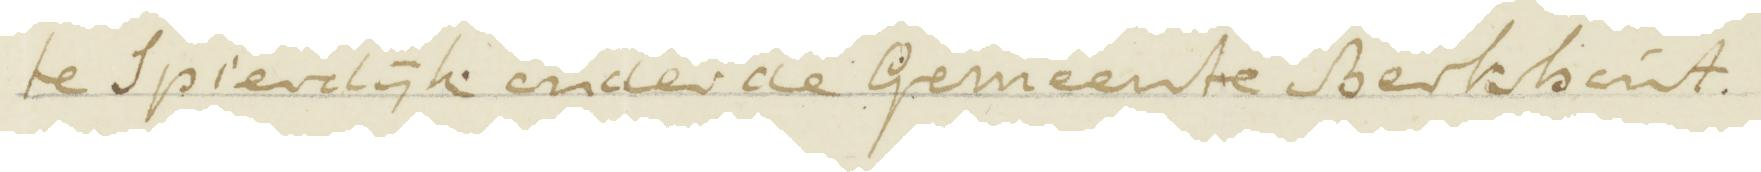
te Spierdijk onder de Gemeente Berkhout.
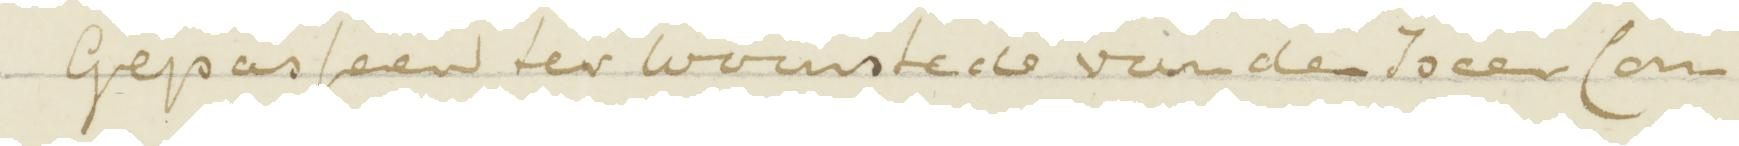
Gepasseerd ter woonstede van de heer Com
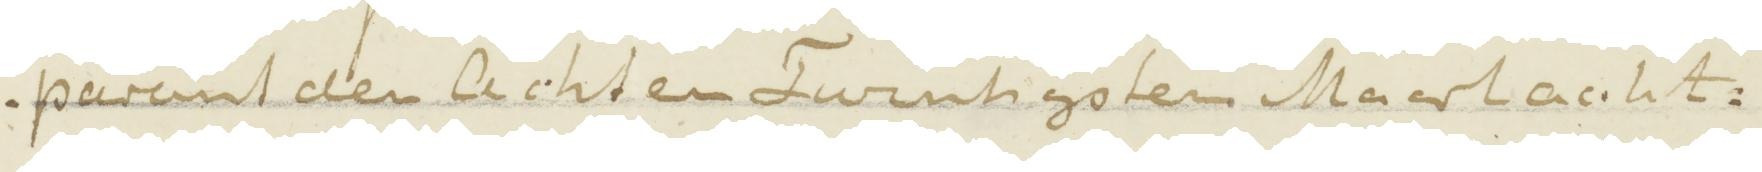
-parant den Acht en Twintigsten Maart acht=
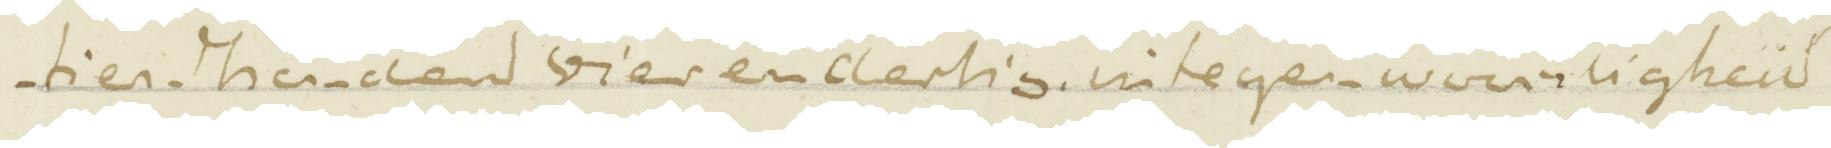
-tien honderd vier en dertig, integenwoordigheid
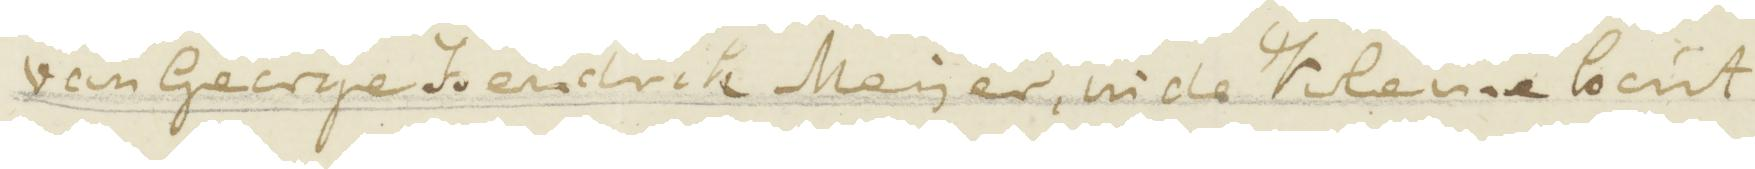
van George hendrik Meijer, in de Kleine hout
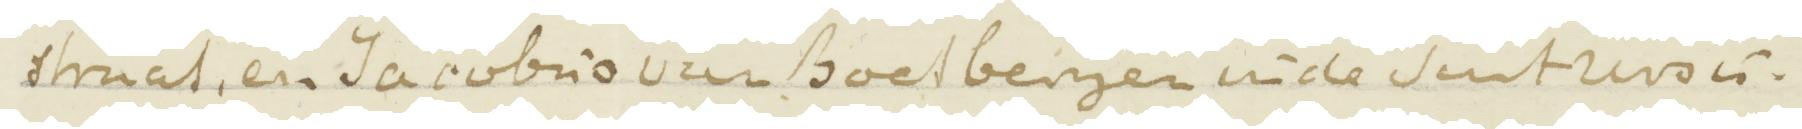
straat, en Jacobus van Boetbergen in de sint ursu-
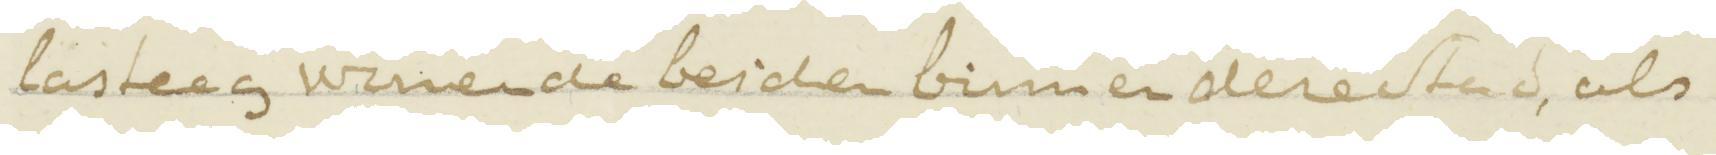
lasteeg wonende beiden binnen deze stad, als
